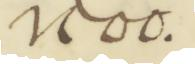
1500.
